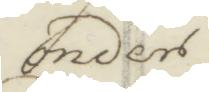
Onder
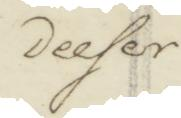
deeser
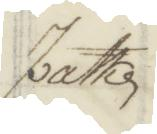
pakken
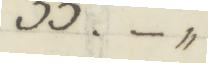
33. — „
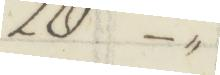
28 — „
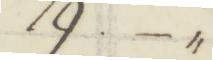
19. — „
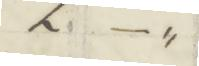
2 — „
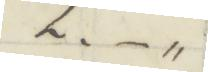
2. — „
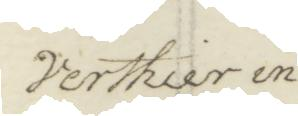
Verthier in
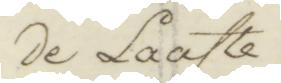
de Laaste
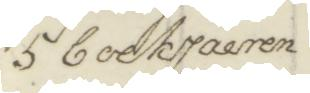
5 boekjaeren
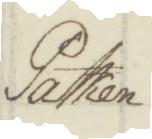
Pakken
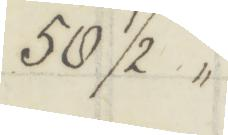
58½ „
